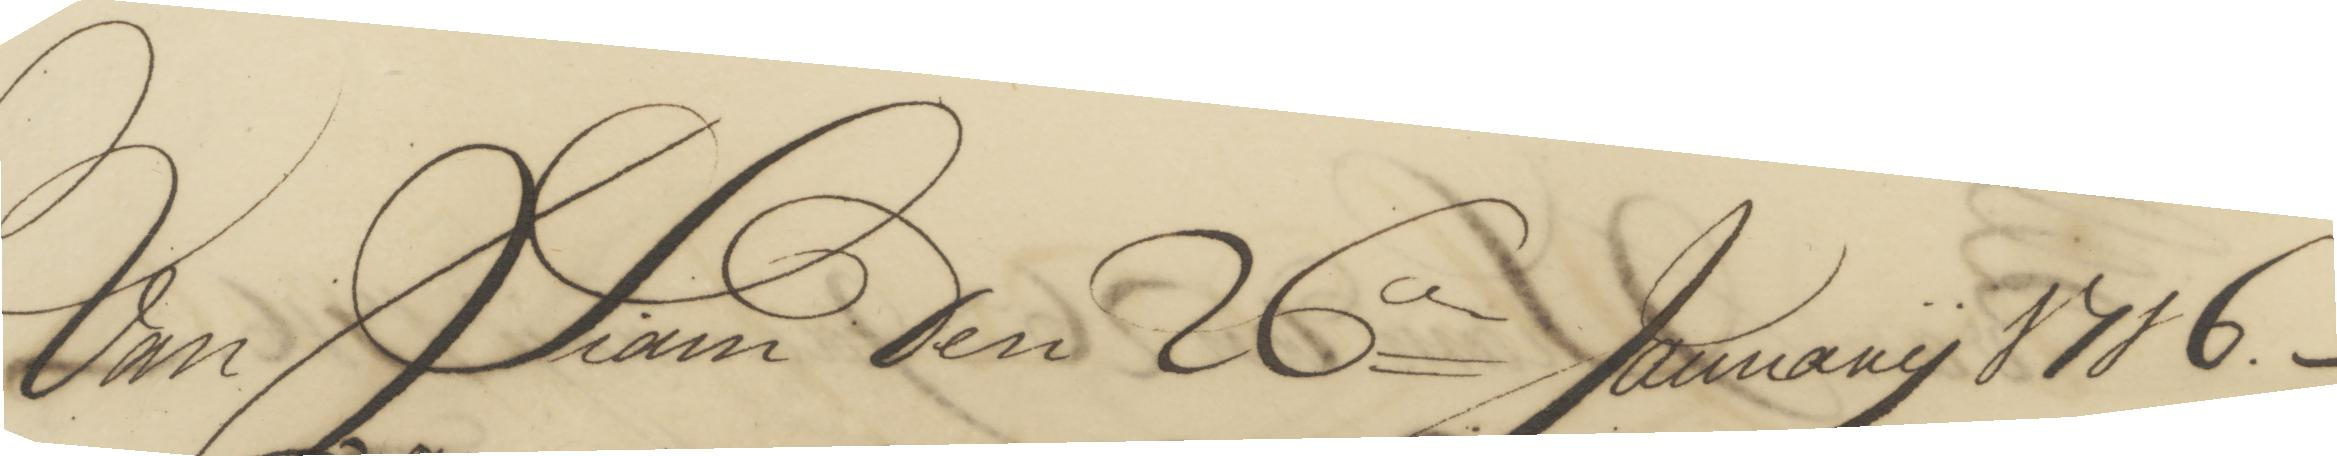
Van Siam den 26=en Januarij 1716.
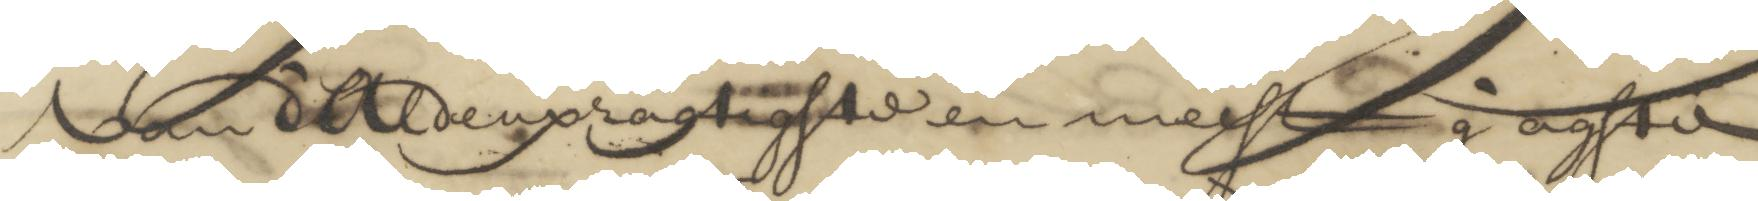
van d'Alderpragtigste en meest g'agste
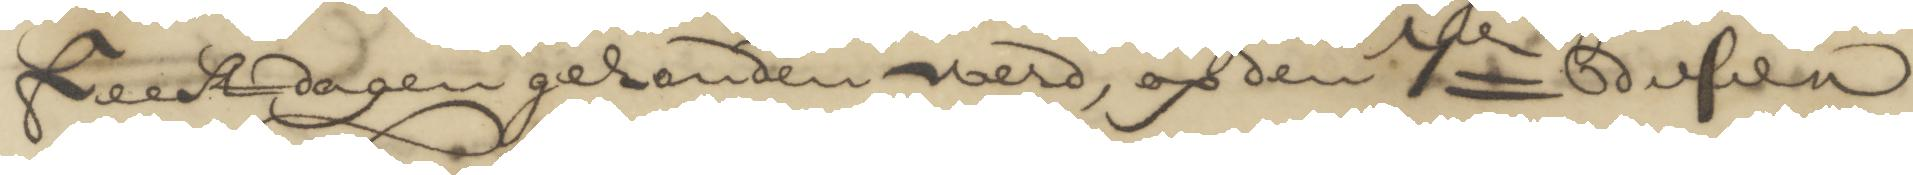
feestdagen gehouden werd, op den 7=en desen
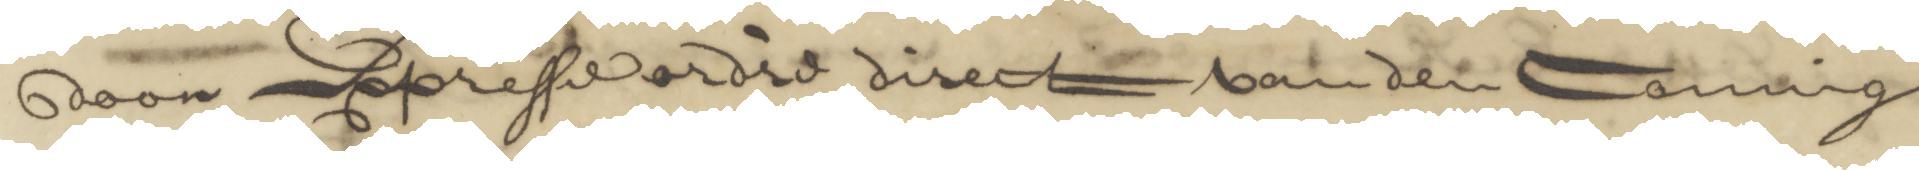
door Expresse ordre direct van den Coning
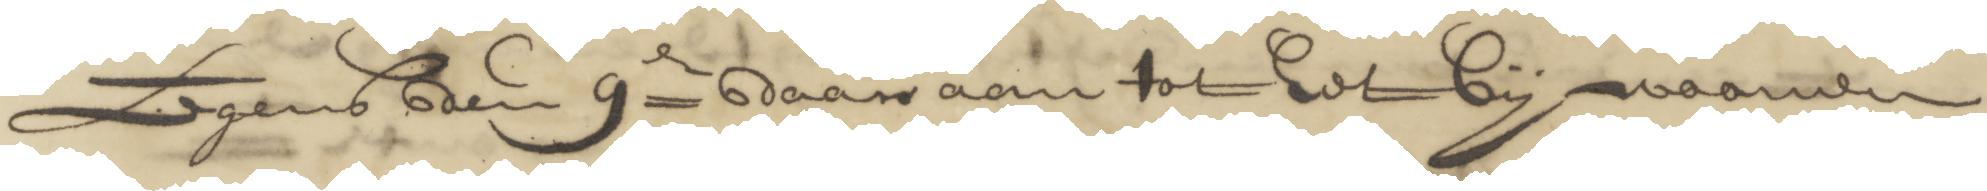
tegens den 9=en daar aan tot het bij woonen
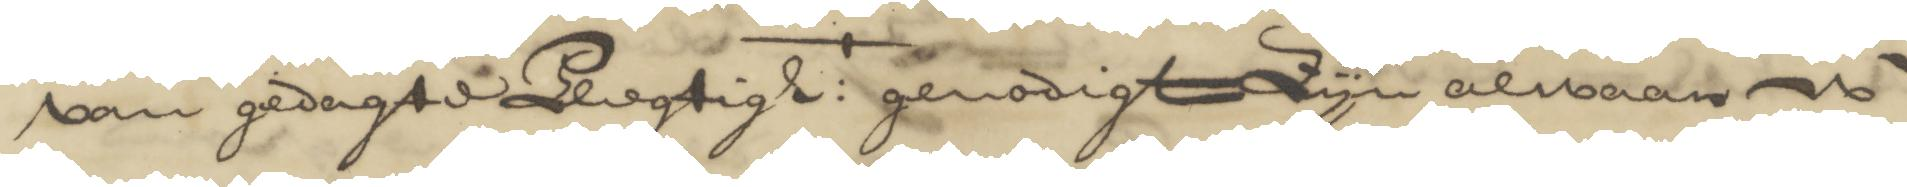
van gedagte Plegtigh:t genodigt zijn alwaar w'
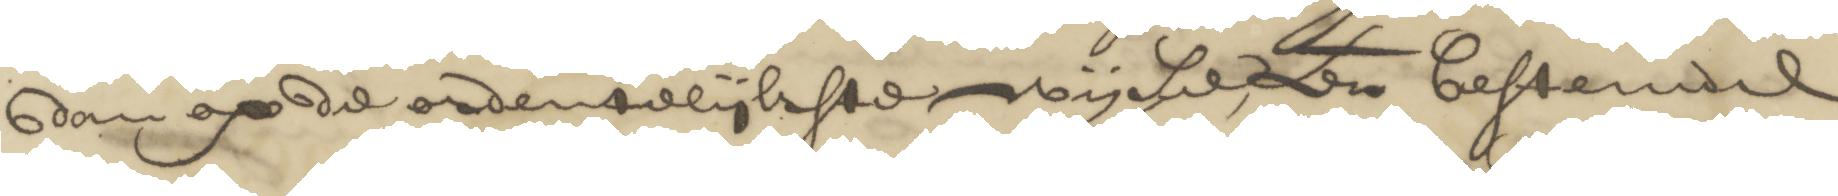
dan op de ordentelijkste wijse, ten bestemde
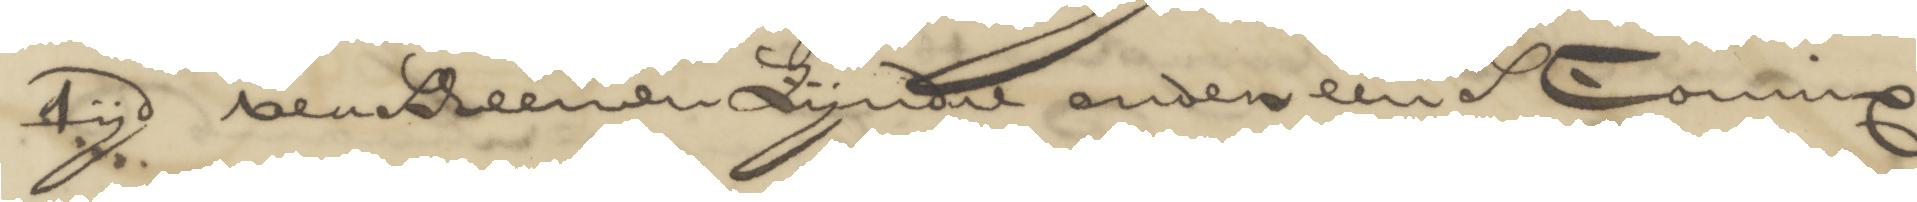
tijd verscheenen zijnde onder een 's Coninx
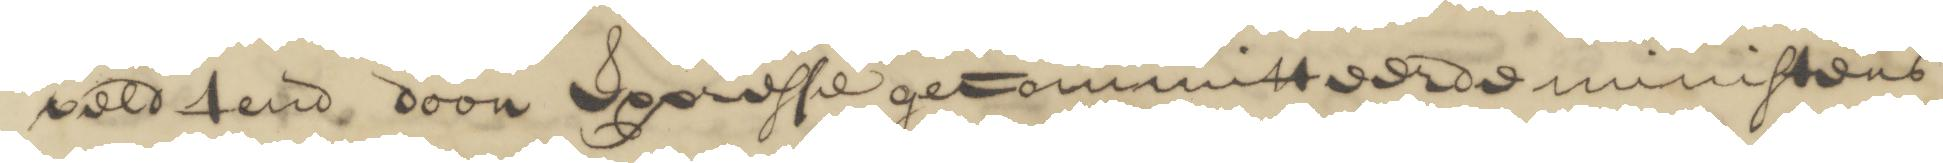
veld tend door Expresse gecommitteerde ministers
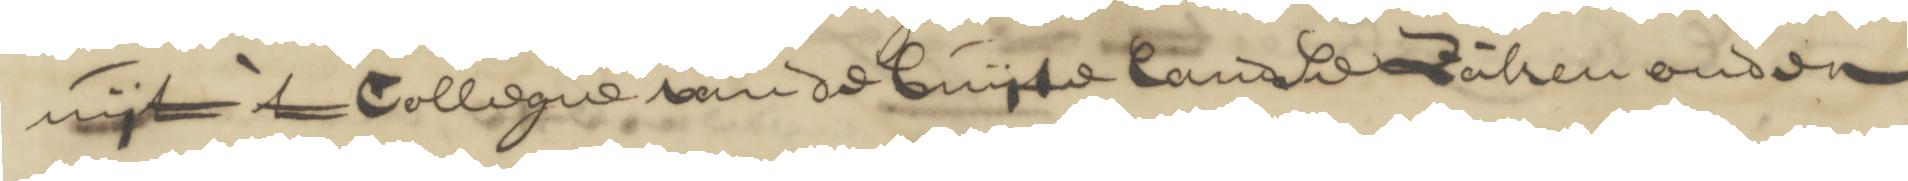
uijt ’t Collegie van de buijte landse zaken onder
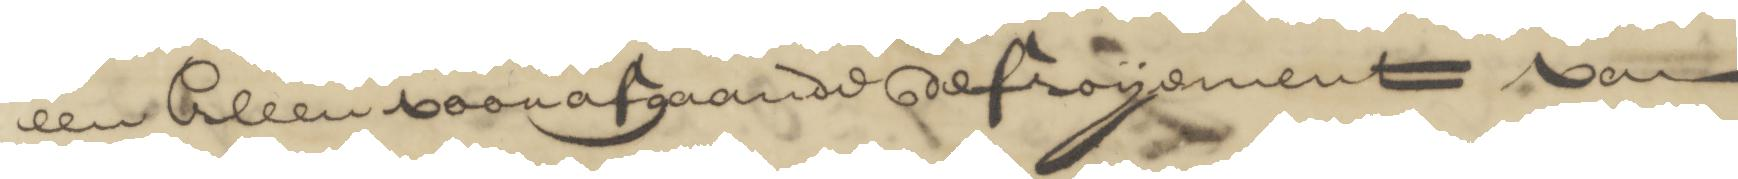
een kleen voor afgaande defroijement van
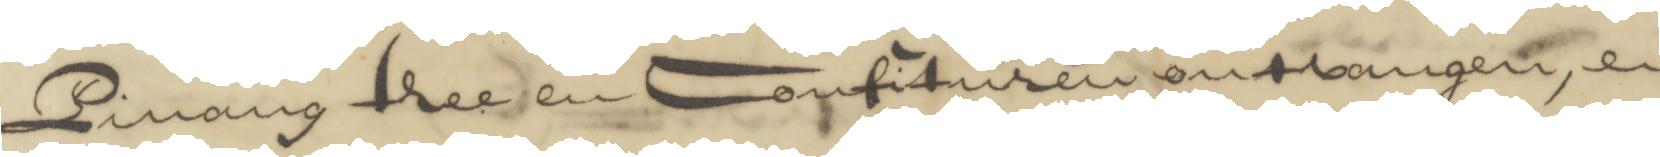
Pinang thee en Confituren ontvangen, en
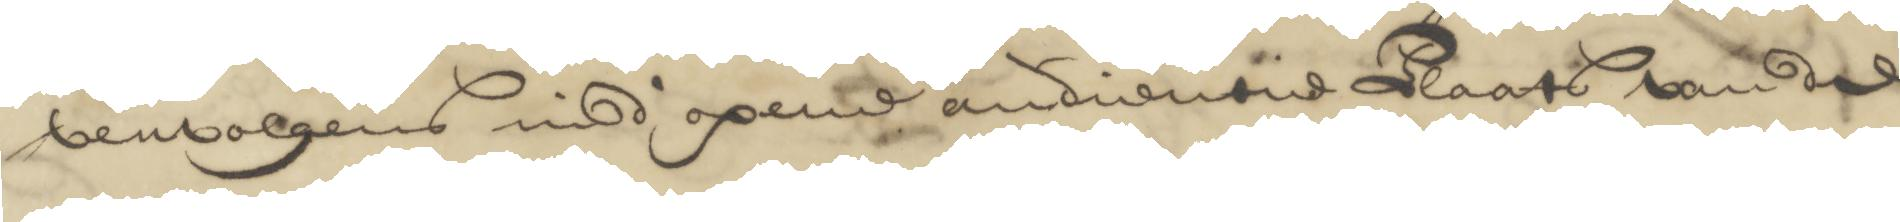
vervolgens in d’ opene audientie Plaats van de
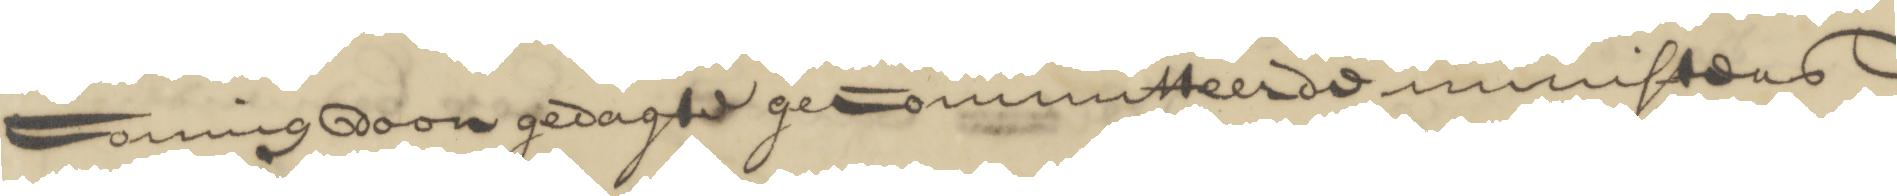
Cconing door gedagte gecommitteerde ministers
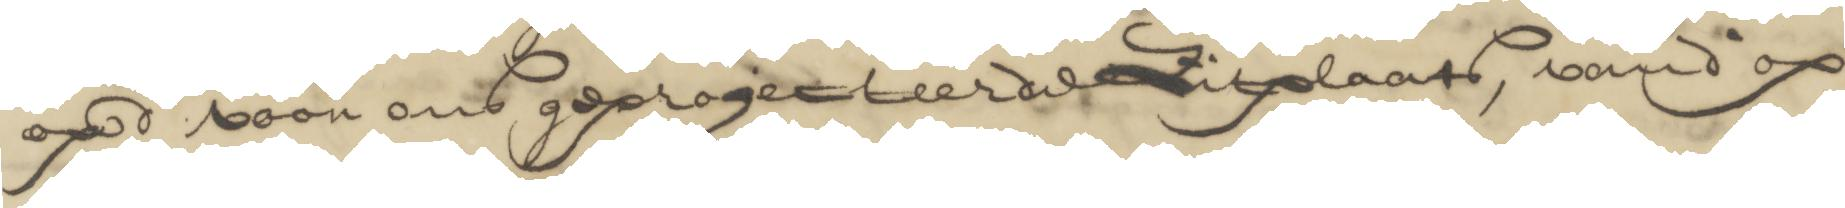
op d' voor ons geprojecteerde zitplaats, van d'op
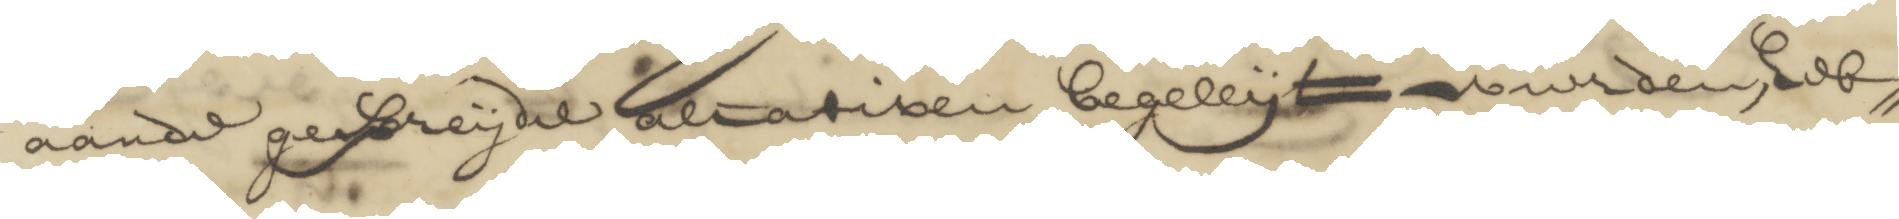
aande gespreijde alcativen begeleijt wierden, heb
